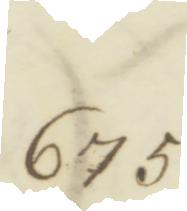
675
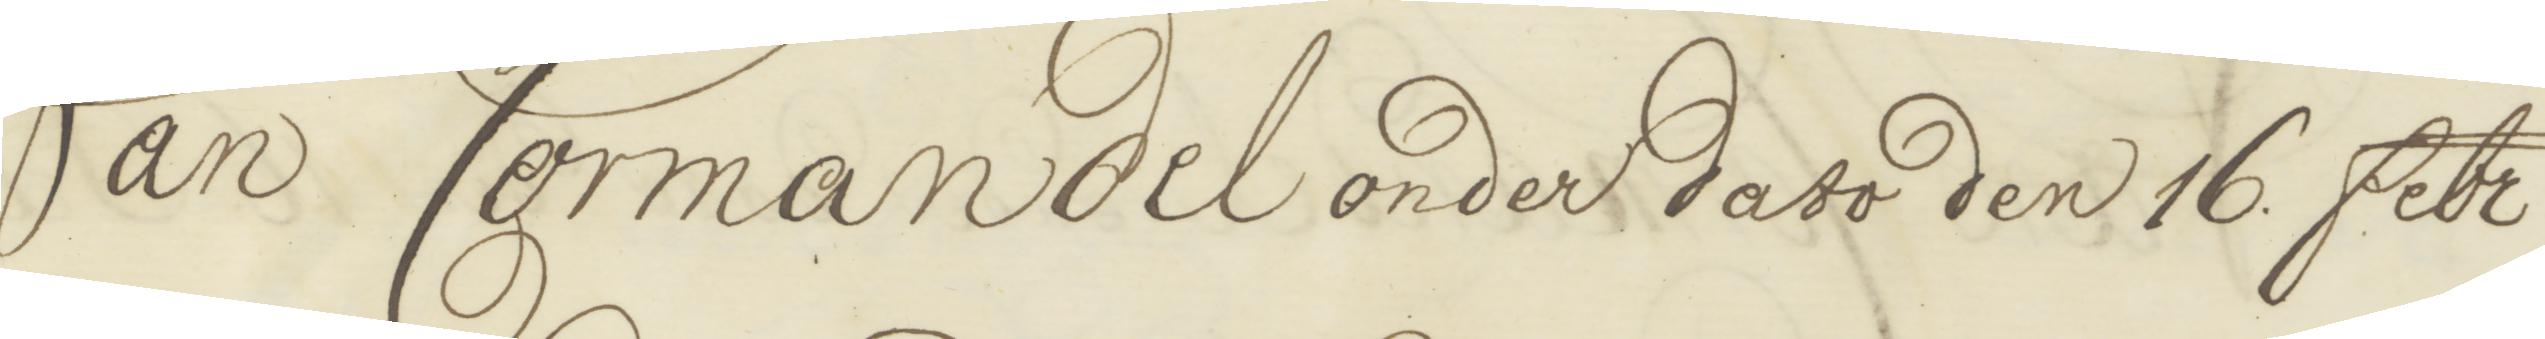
Van Cormandel onder dato den 16. febr
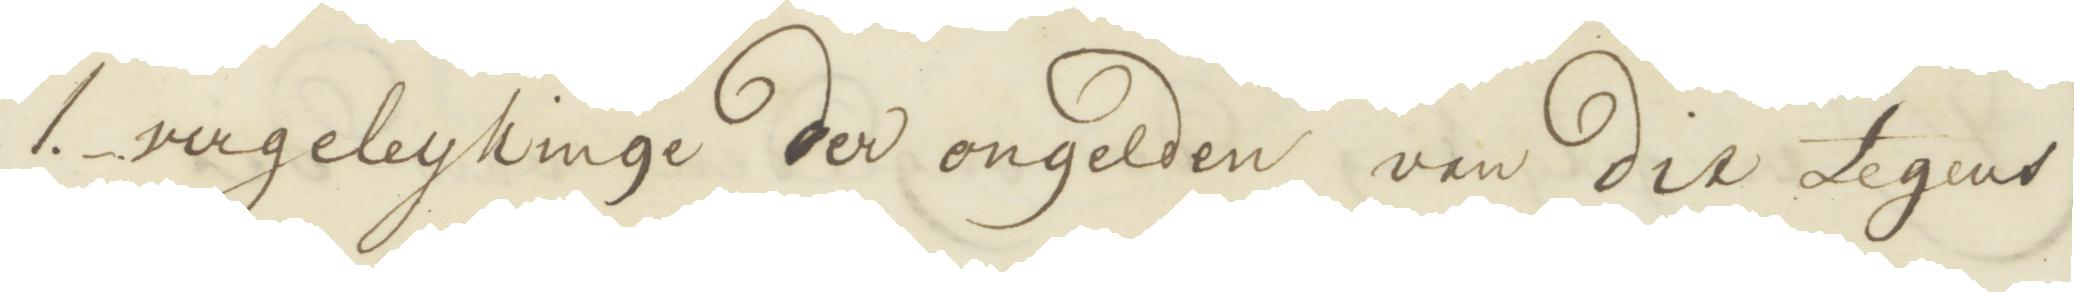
1. -. vergeleykinge der ongelden van dit tegens
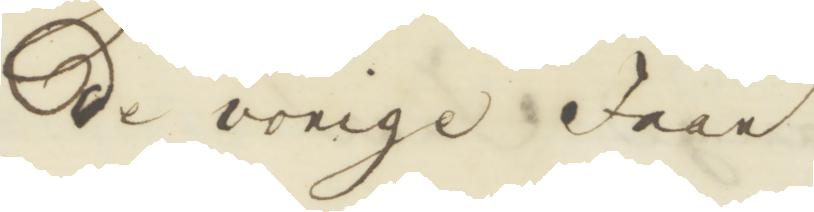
de vorige Jaar
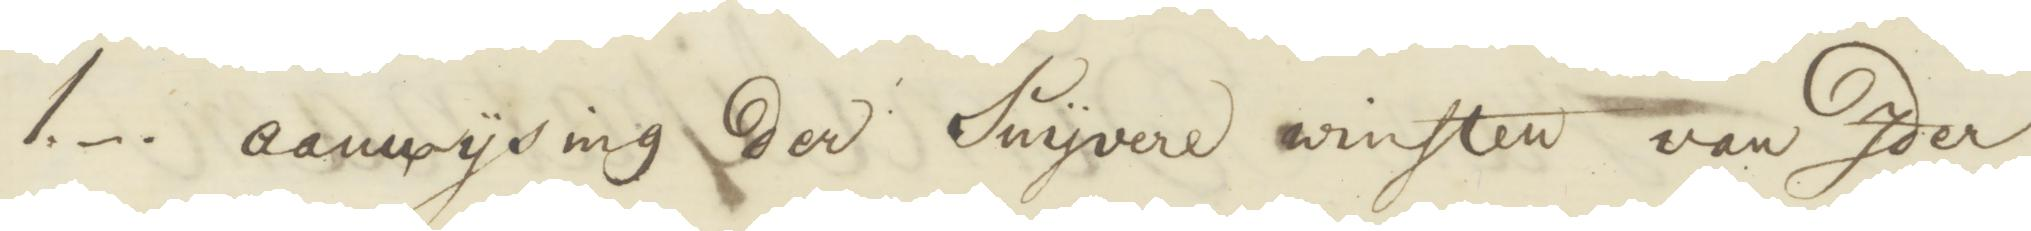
1.-. aanwijsing der suijvere winsten van Jder
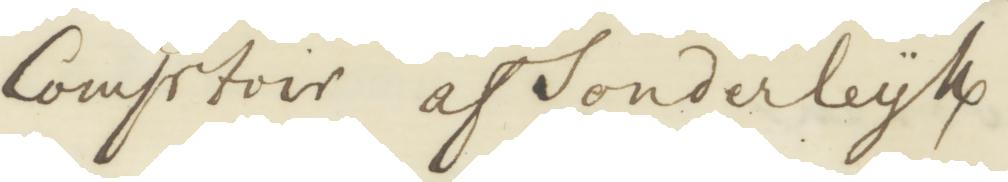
Comptoir afsonderleijk
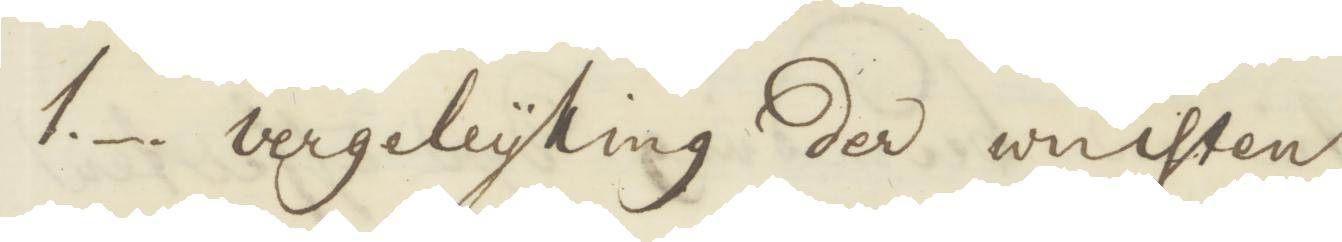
1. —. vergeleijking der winsten
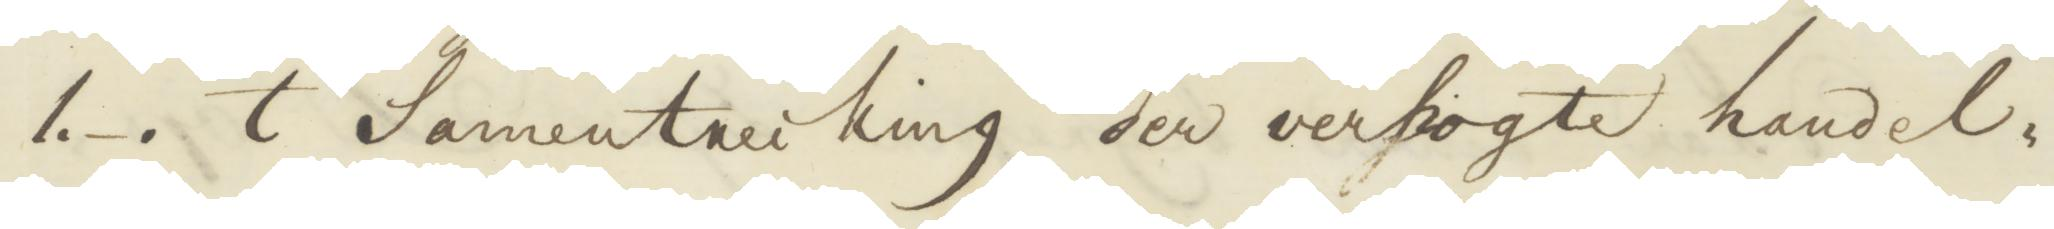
1. —. 't samentrecking der verkogte handel„
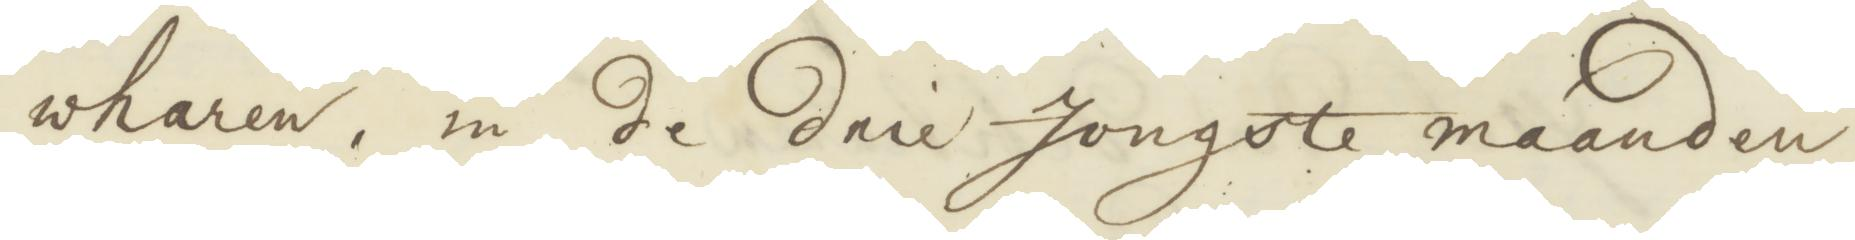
wharen, in de drie Jongste maanden
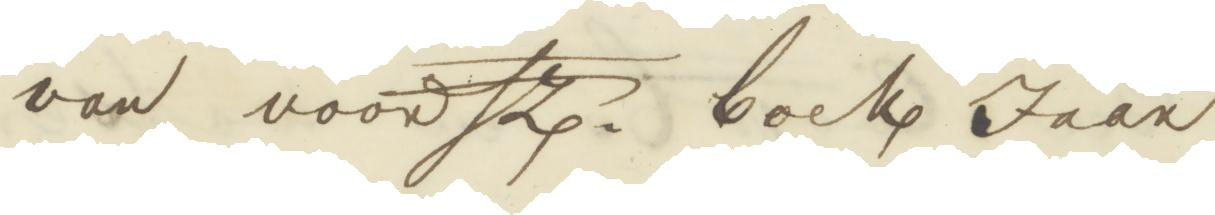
van voorsz. boek Jaar
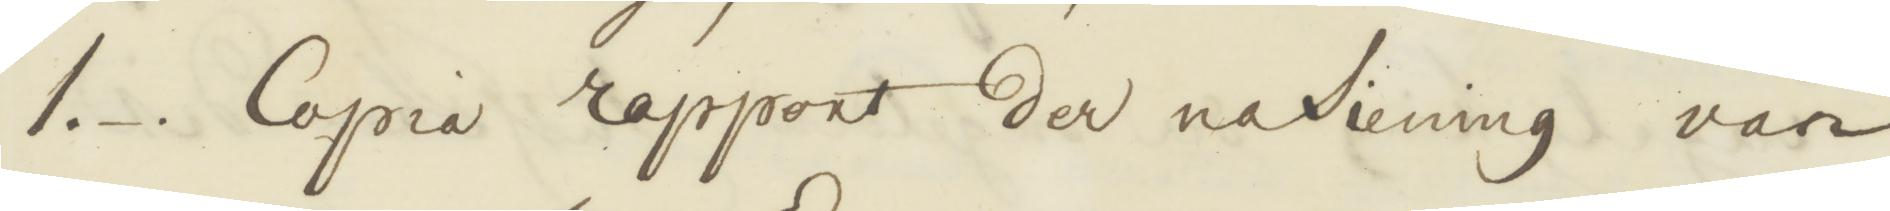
1. —. Copia rapport der nasiening van
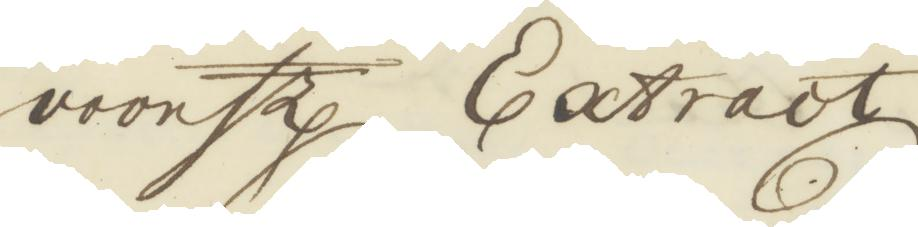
voorsz Extract
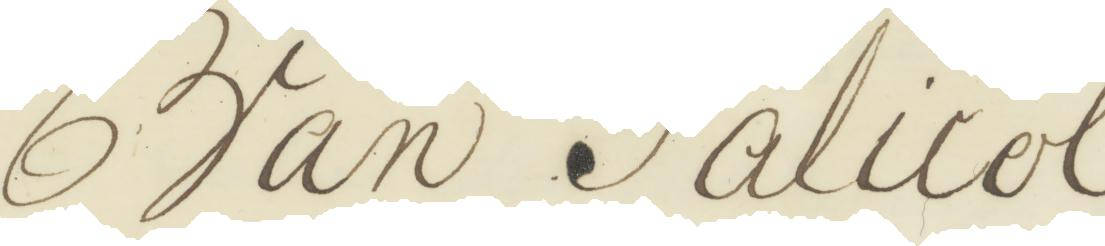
Van Palicol
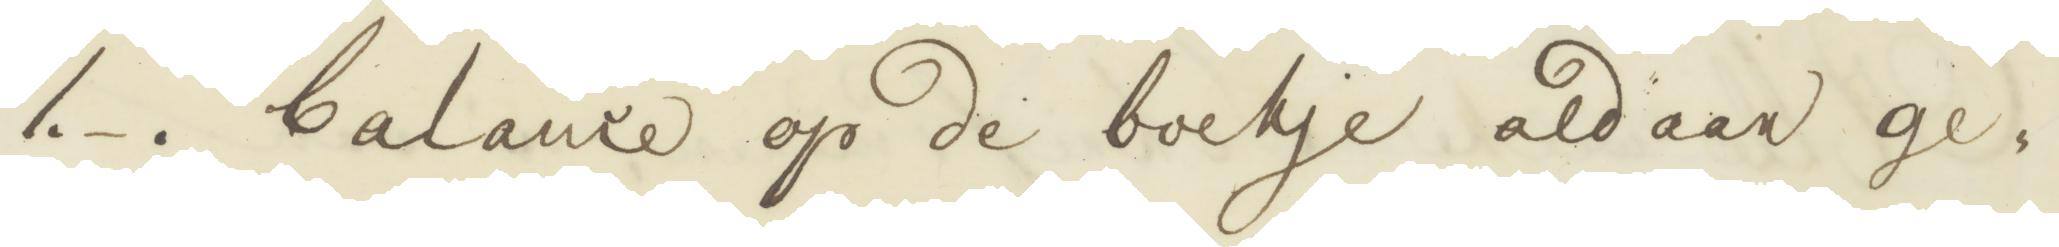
1. —. balance op de boekje aldaar ge„
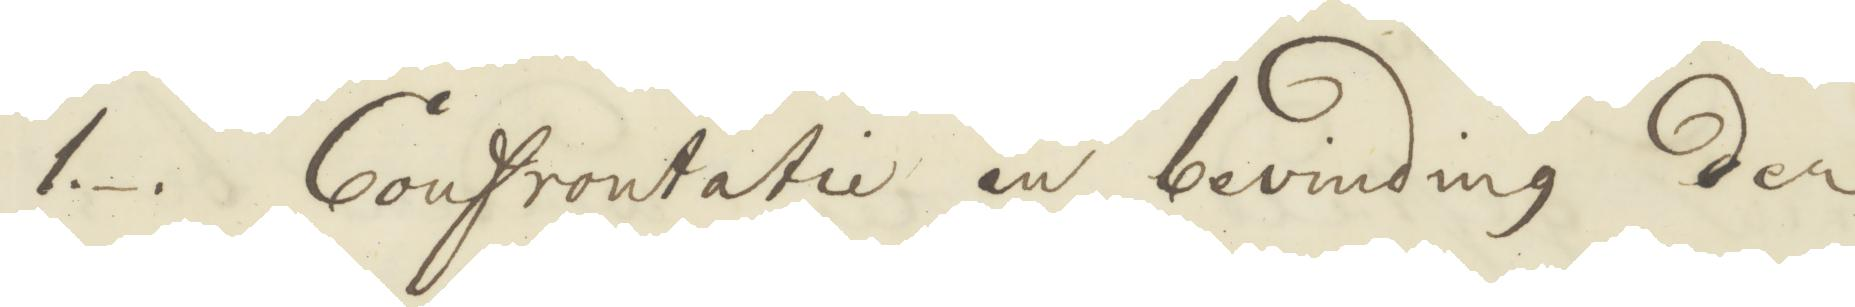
1. —. Confrontatie en bevinding der
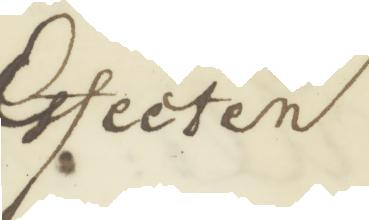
Effecten
